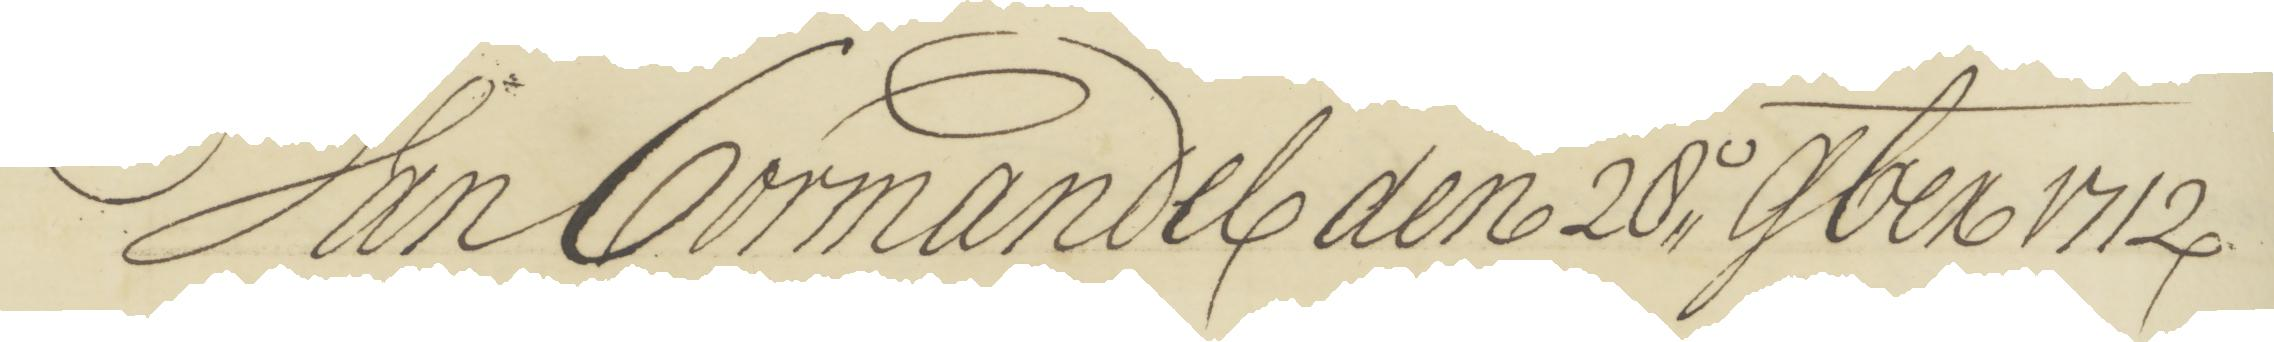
Van Cormandel den 28„e gber 1712.
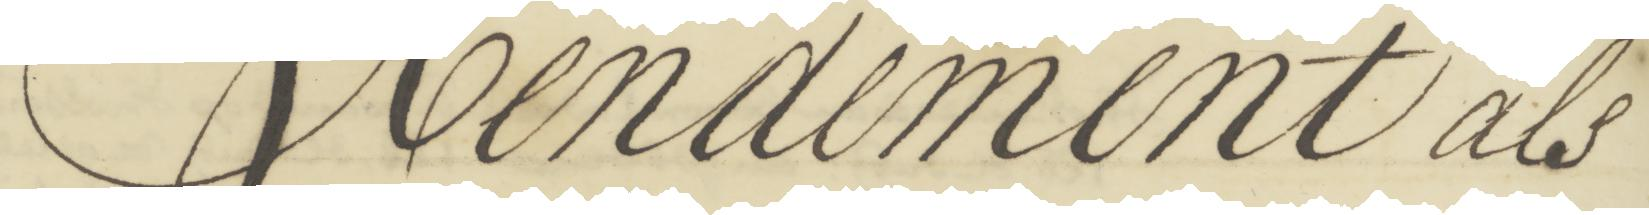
Rendement als
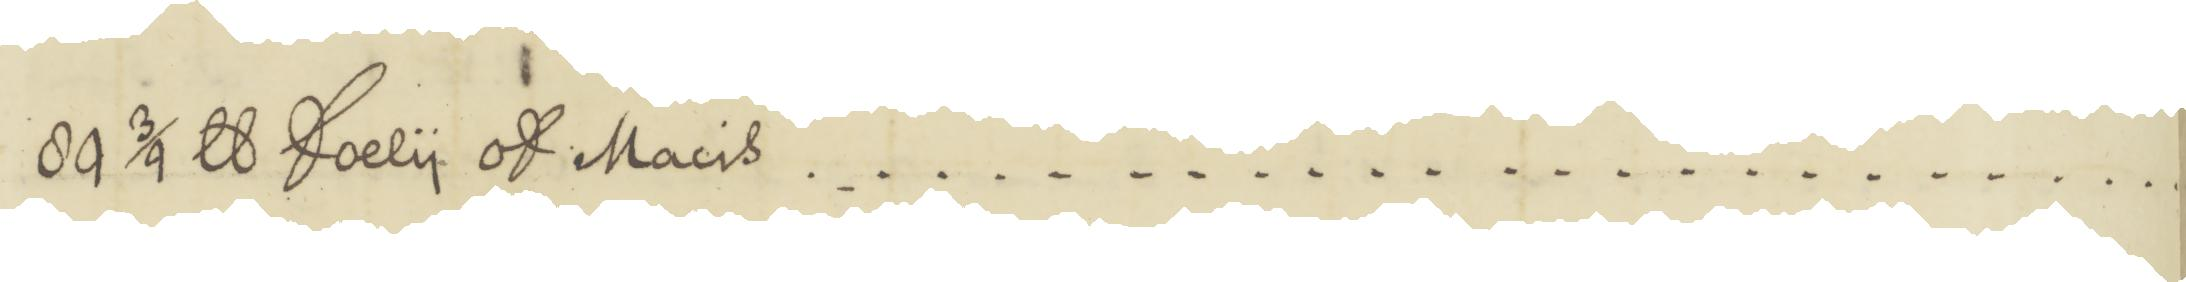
84¾ lb foelij of Macis - - - - - - - - - - - - - - - - - - - - - - -
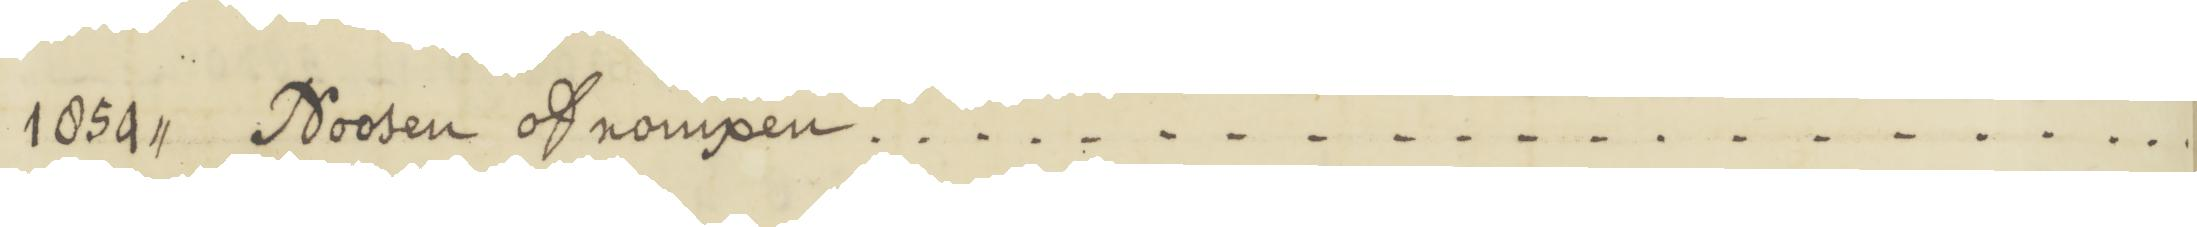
1854„ Nooten of rompen - - - - - - - - - - - - - - - - - - - -
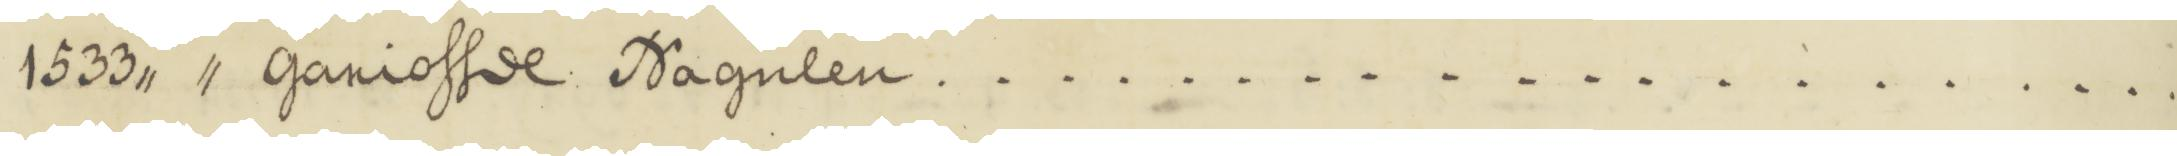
1533„ „ gariossel Nagulen - - - - - - - - - - - - - - - - - - - -
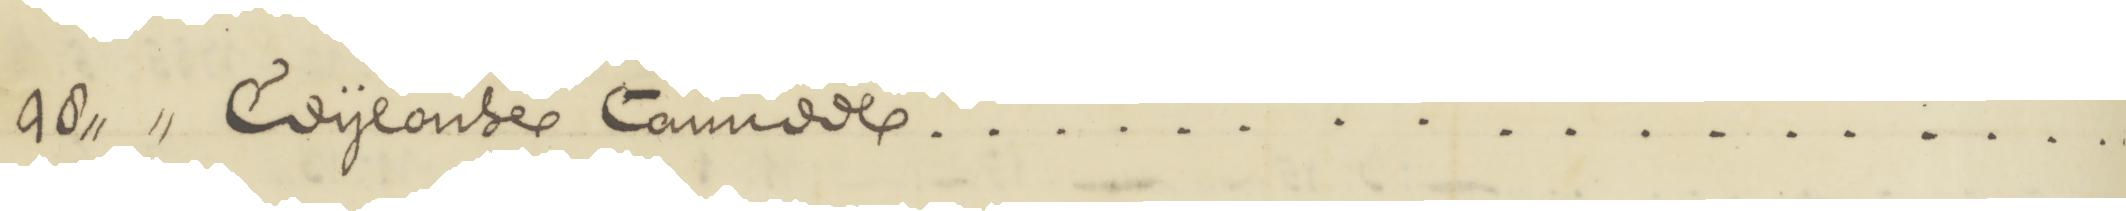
48„ „ Ceijlonse Canneel - - - - - - - - - - - - - - - - - -
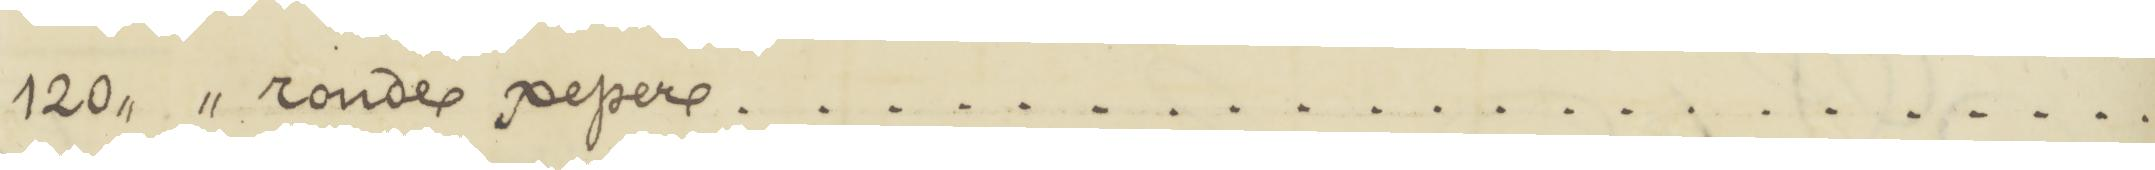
120„ „ ronde peper - - - - - - - - - - - - - - - - - - - - - - - -
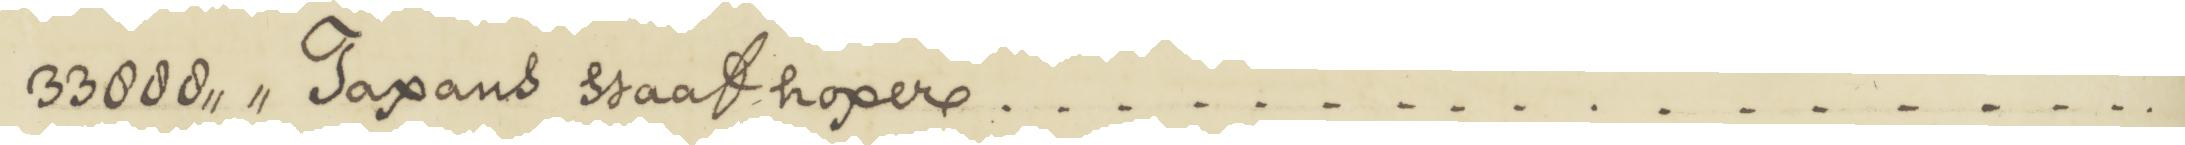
33888„ „ Iapans staaf koper - - - - - - - - - - - - - - - - - -
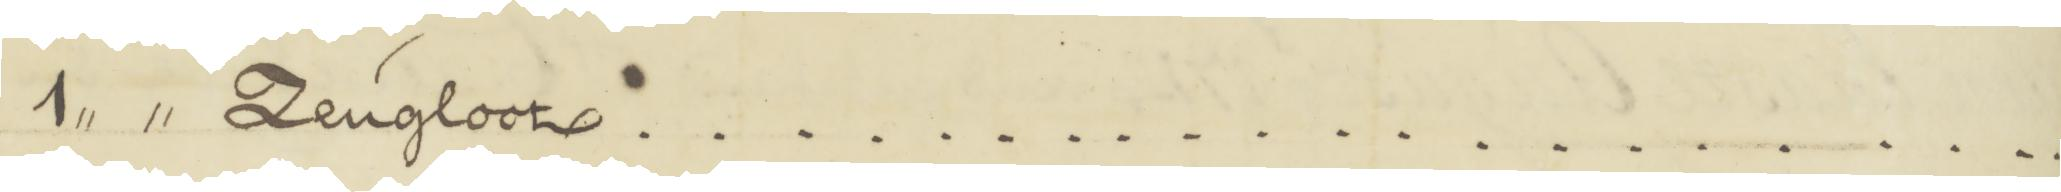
1„ „ Zeugloot - - - - - - - - - - - - - - - - - - - - -
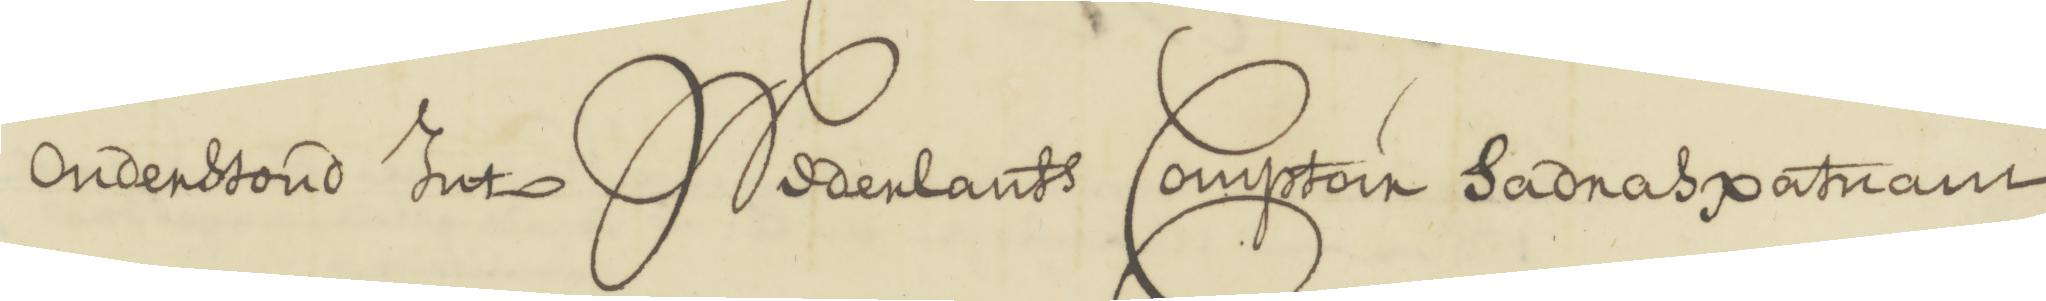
onderstond Int Nederlants Comptoir sadraspatnam
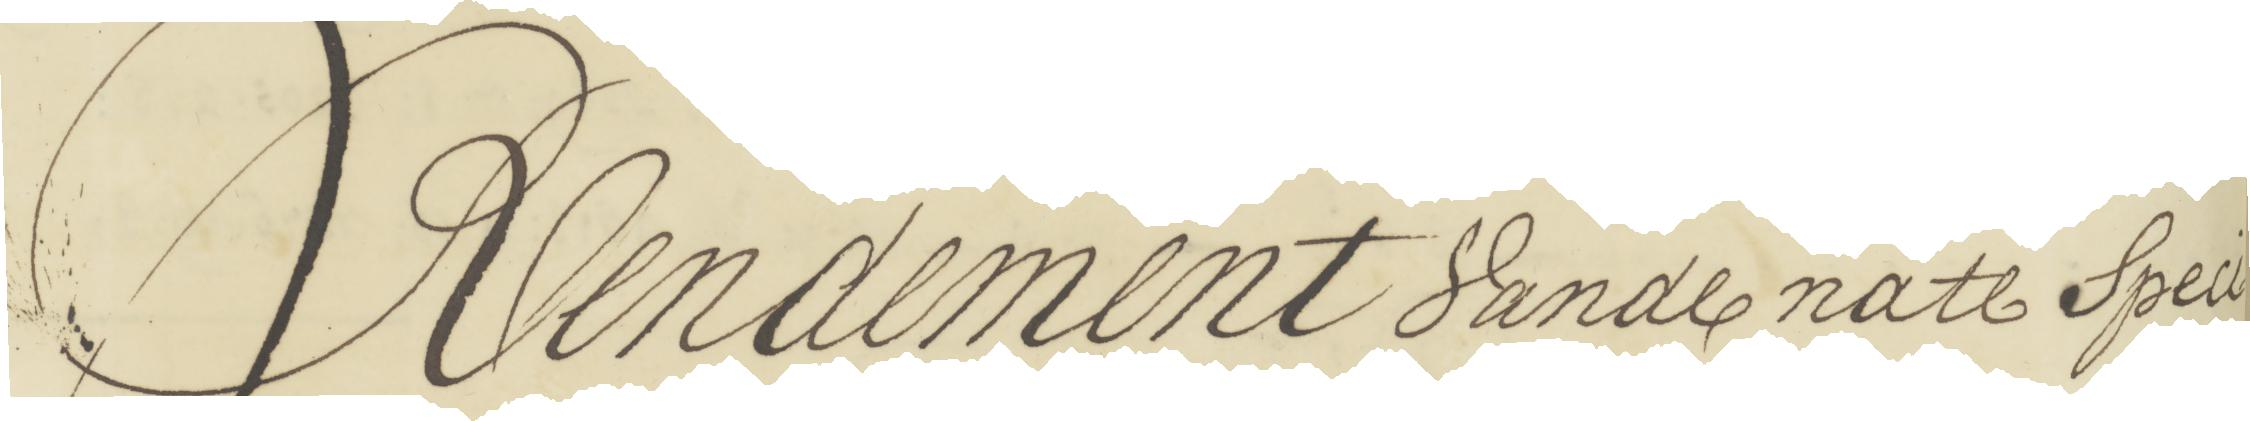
Rendement Vande nate speci
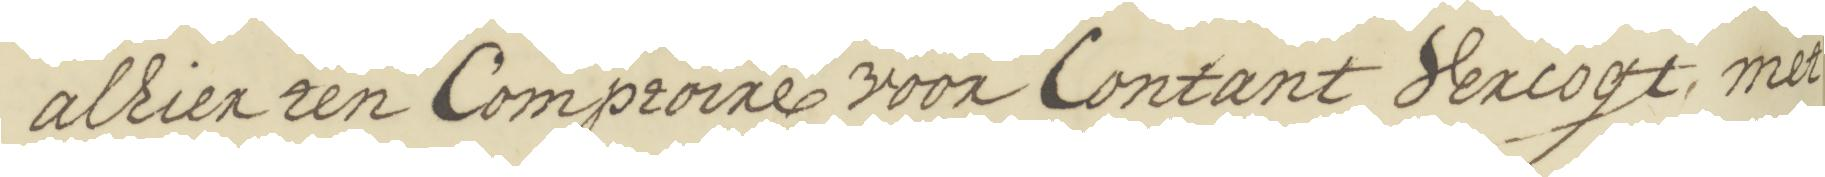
alhier een Comptoire voor Contant Vercogt, met
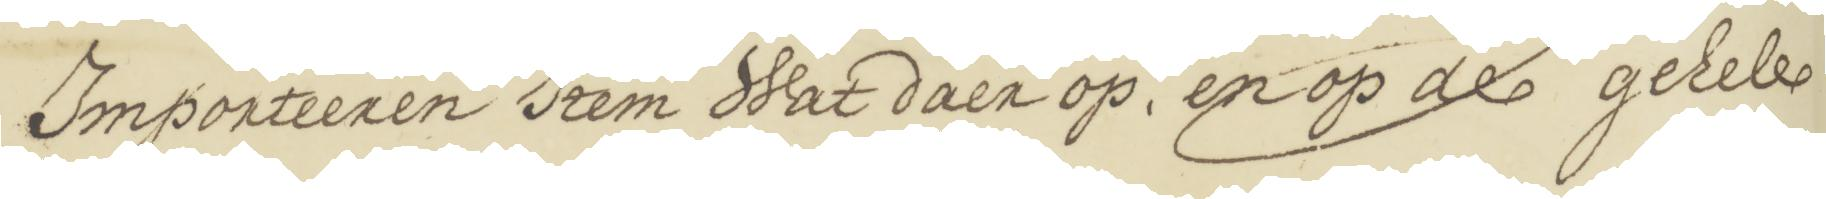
Importeeren Item Wat daer op, en op de gehele
